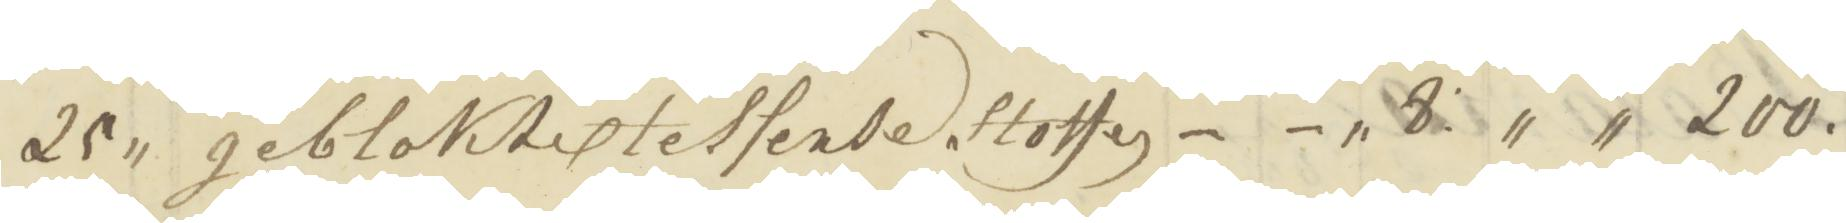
25„ geblokte tesserse stoffen — — „ 8: „ „ 200.
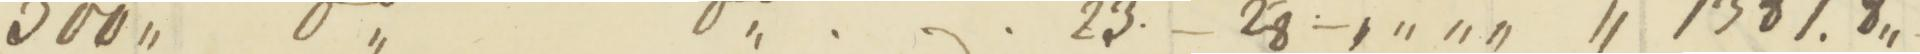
300„ d„o d„o 23. — 2 1/8: — „ „ „ „ „ 1387.8„
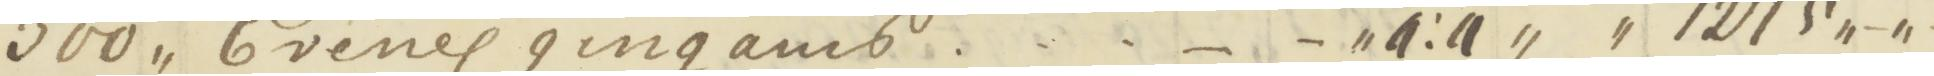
300„ Evene gingams . . . „ 4:4 „ „ 1275„- „
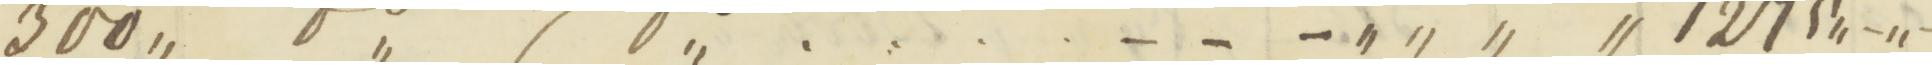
300„ d„o d„o . . . . — — — „ „ „ „ 1275„-„
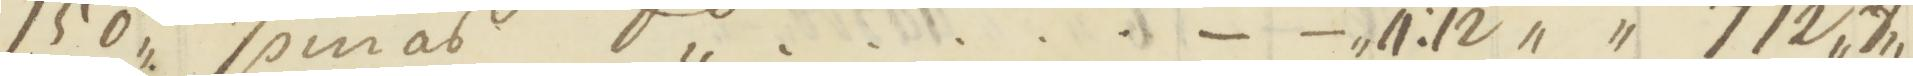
150„ pinas d„o . . . . . — —„4:12 „ „ 712„8„
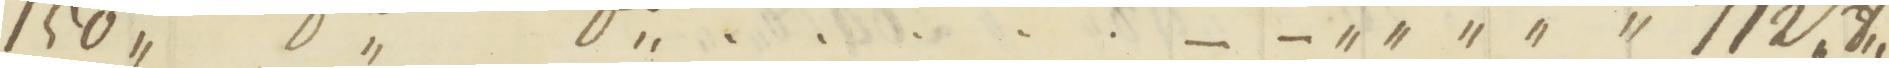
150„ d„o d„o . . . . . — — „ „ „ „ „ 712„8„
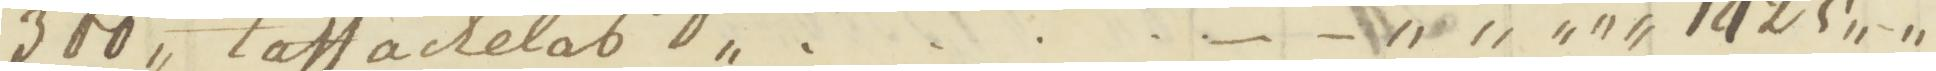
300„ taffachelas d„o . . . . .—— „ „ „ „ „ 1425„—„
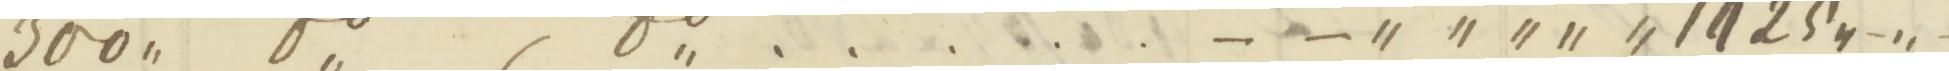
300„ d„o d„o . . . . . - - „ „ „ „ „ 1425„—„
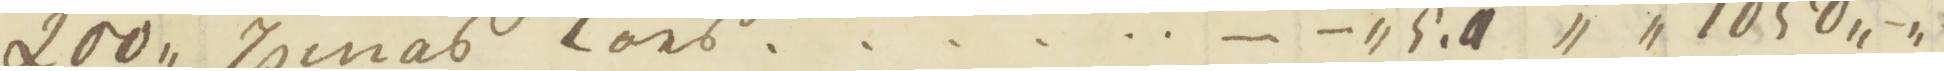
200„ pinas Cors. . . . . .— — „ 5:4 „ „ 1050„—„—
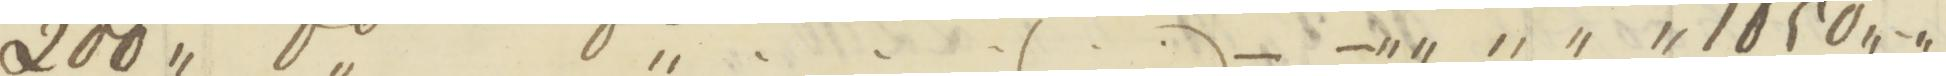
200 „ d„o d„o . - - . . — — „ „ „ „ „ 1050„—„—
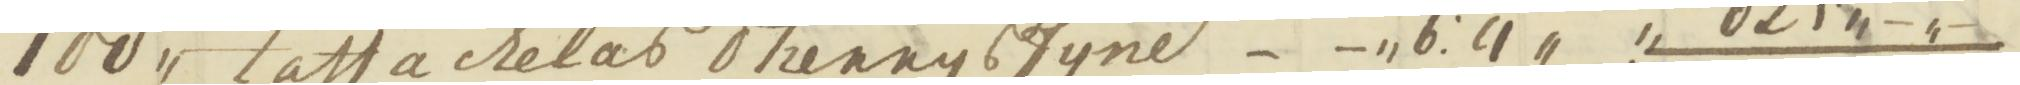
100„ taffachelas d'herrijs fijne - - „6:4 „ 625„—„—
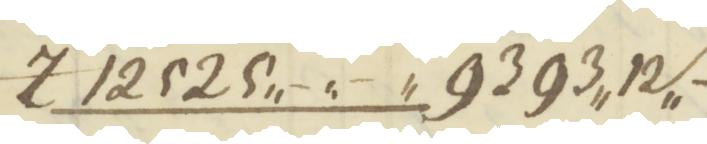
r 12525„—„—„ 9393„12„—
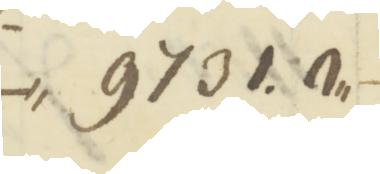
„ 9731.4„
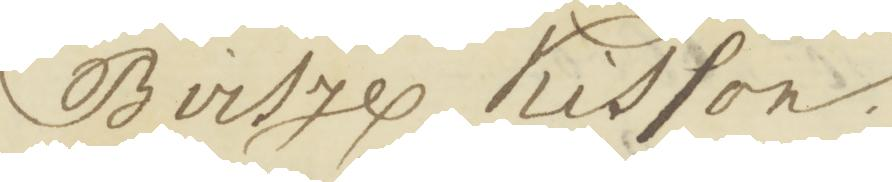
Birsje kissor.
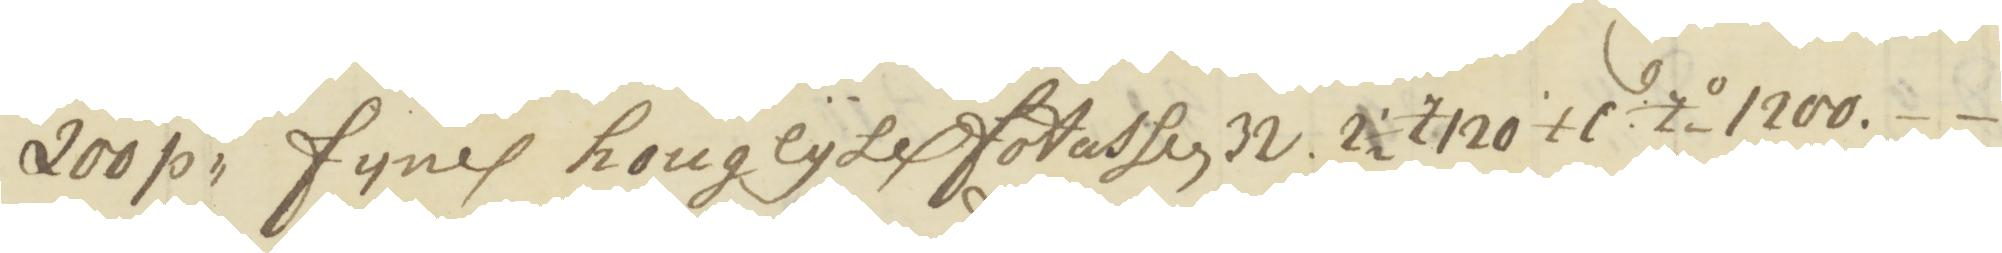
200 p„s fijne houglijze fotassen 32. 2½ r120 tl:g r_o 1200.——
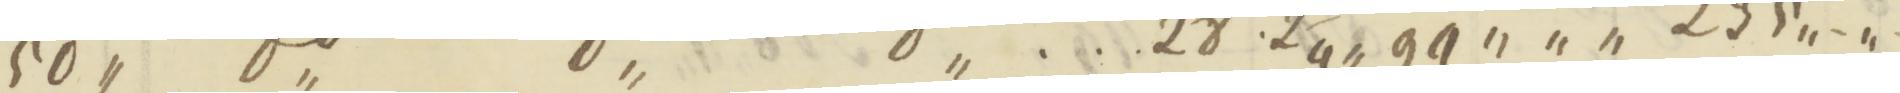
50 „ d„o d„o d„o . . . 28 2¼„ „ 94 „ „ „ 235„— „
